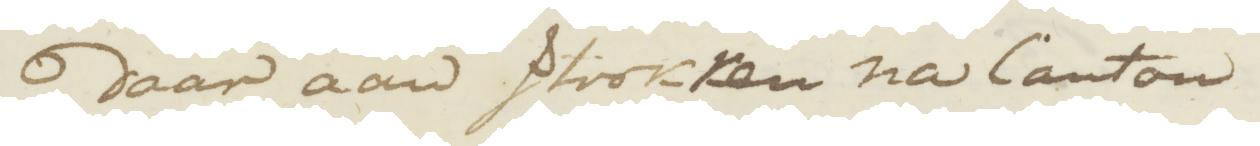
daar aan vertrokken na Canton
